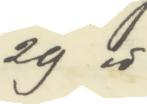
29 id
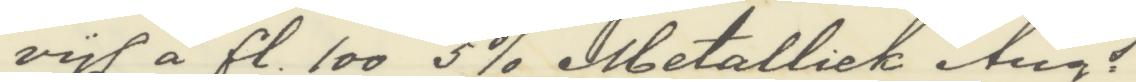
vijf á fl. 100 5% Metalliek Aug.s
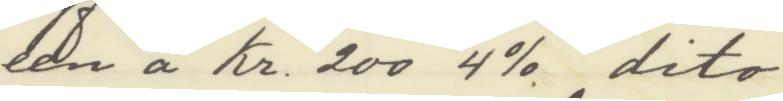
een á Kr. 200 4%. dito
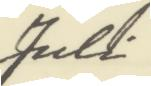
Juli
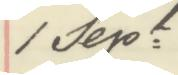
1 sep=t
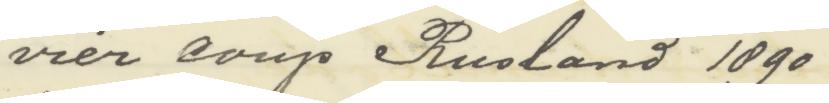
vier coup Rustand 1890
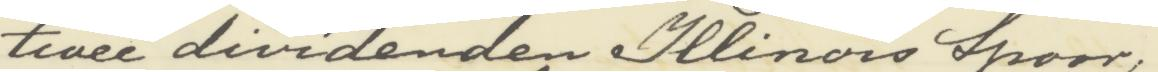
twee dividenden Illinois Spoor:
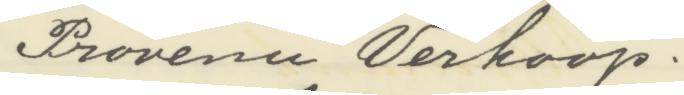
Provenu Verkoop.
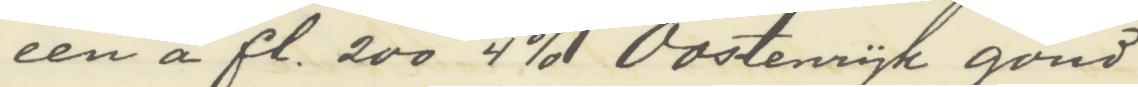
een á fl. 200 7% Oostenrijk goud
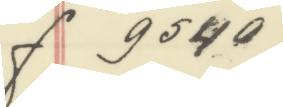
ƒ 9540
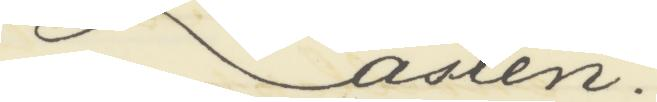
Lasten.
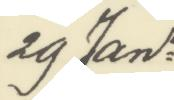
29 Jan=r
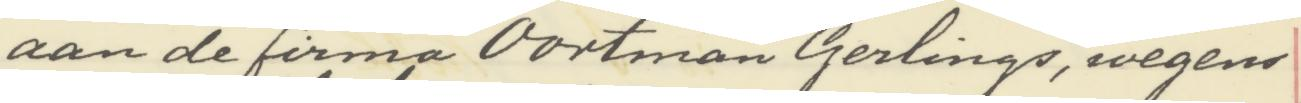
aan de firma Oortman Gerlings, wegens
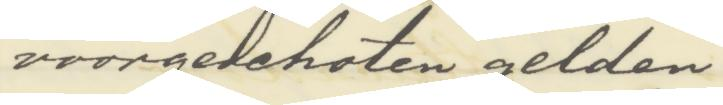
voorgeschoten gelden
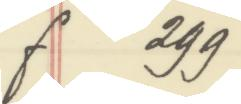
ƒ 299
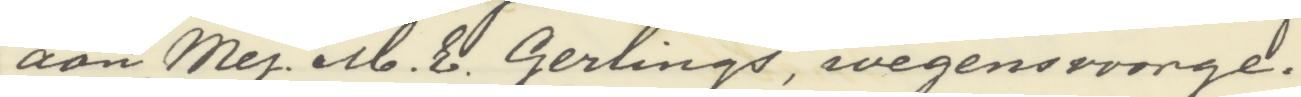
aan Mej. M. E. Gerlings, wegens voorge=
